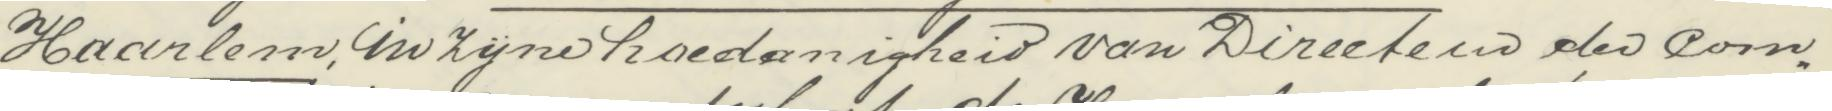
Haarlem, in zijne hoedanigheid van Directeur der com„
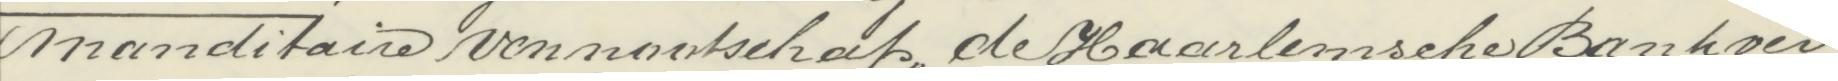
manditaire vennootschap „ de Haarlemsche Bankver
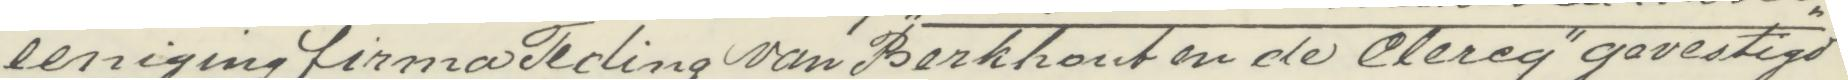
eeniging firma Teding van Berkhout en de Clercq " gevestigd
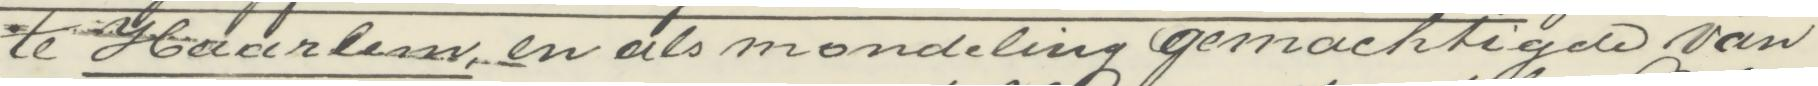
te Haarlem, en als mondeling gemachtigde van
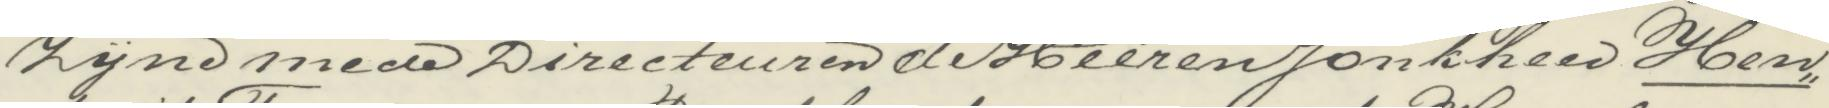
zijne mede Directeuren de Heeren Jonkheer Hen„
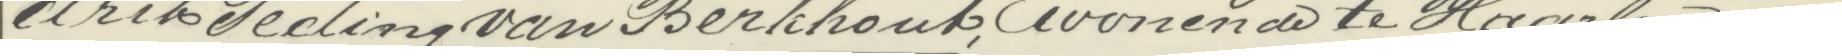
drik Teding van Berkhout, wonende te Haarlem en
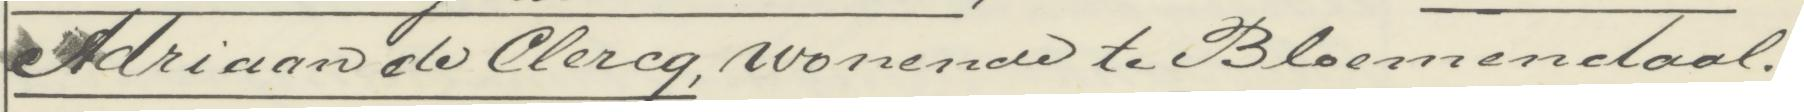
Adriaan de Clercq, wonende te Bloemendaal.
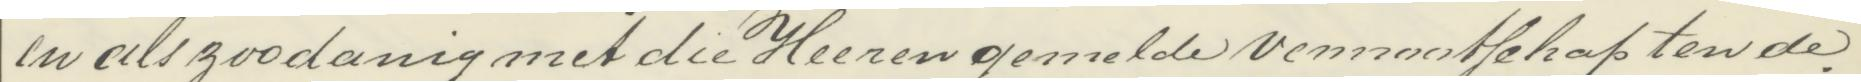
en als zoodanig met die Heeren gemelde vennootschap ten de-
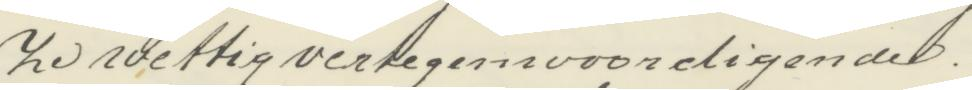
ze wettig vertegenwoordigende.
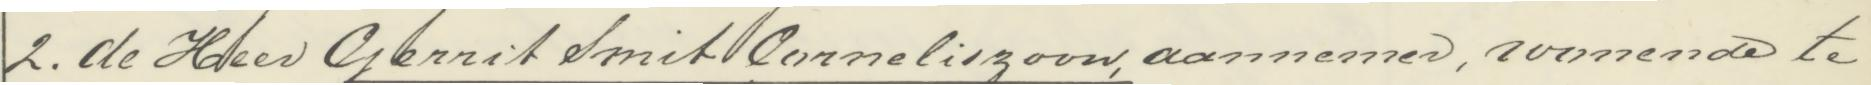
2. de Heer Gerrit Smit Corneliszoon, aannemer, woonende te
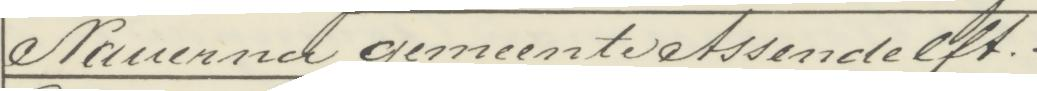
Nauerna gemeente Assendelft.
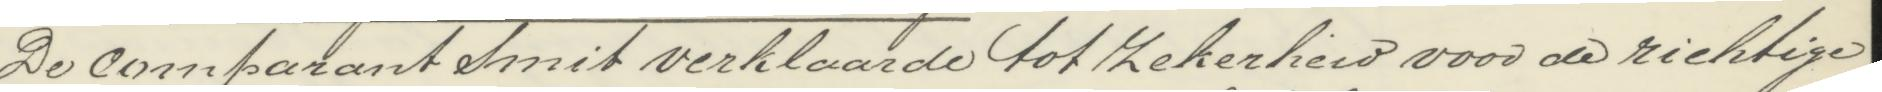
De comparant Smit verklaarde tot zekerheid voor de richtige
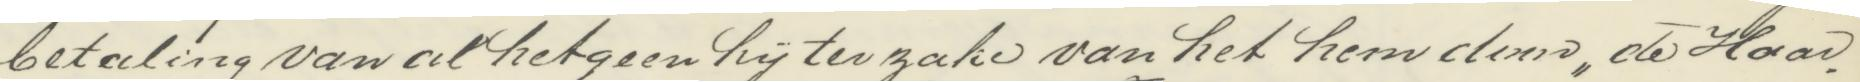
betaling van al het geen hij ter zake van het hem door „ de Haar-
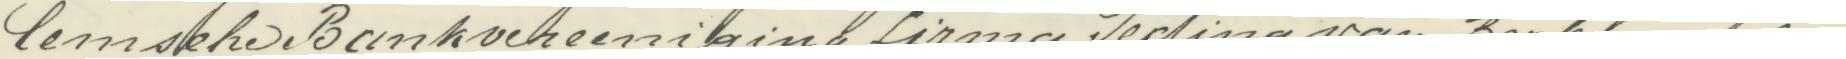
lemsche Bankvereeniging firma Teding van Berkhout en
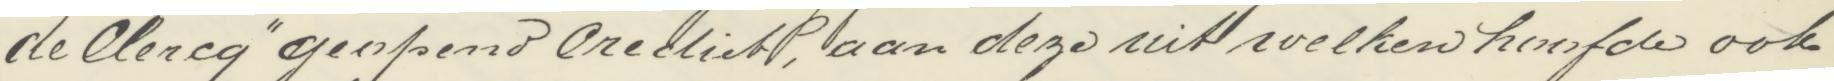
de Clercq " geopend crediet, aan deze uit welken hoofde ook
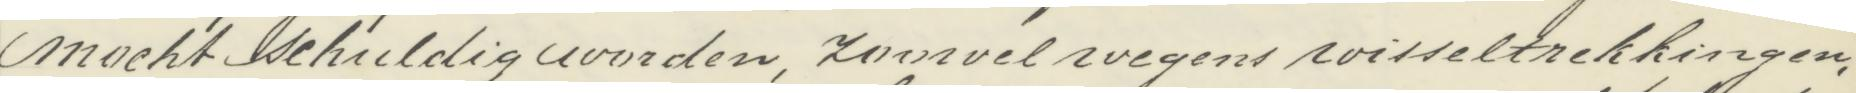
mocht schuldig worden, zoowel wegens wisseltrekkingen,
